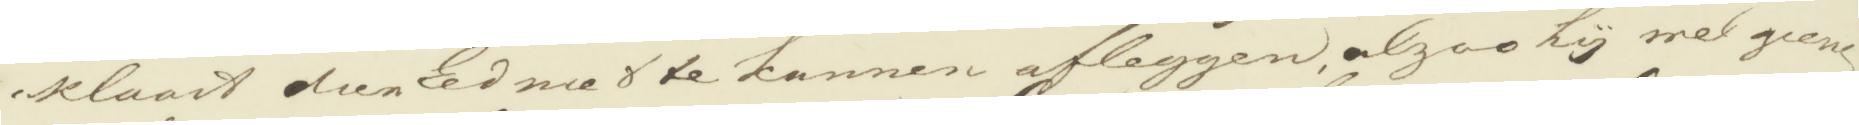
klaart dien Eed niet te kunnen afleggen, alzoo hij wel geene
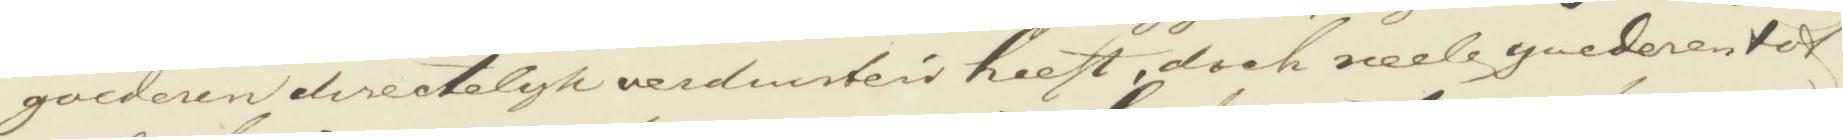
goederen directelyk verduisterd heeft, doch veele goederen tot
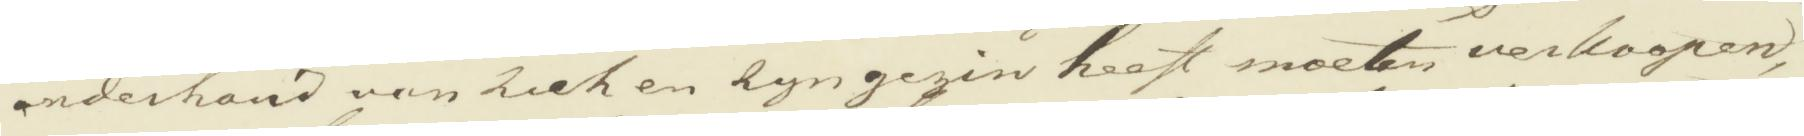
onderhoud van zich en zyn gezin heeft moeten verkoopen,
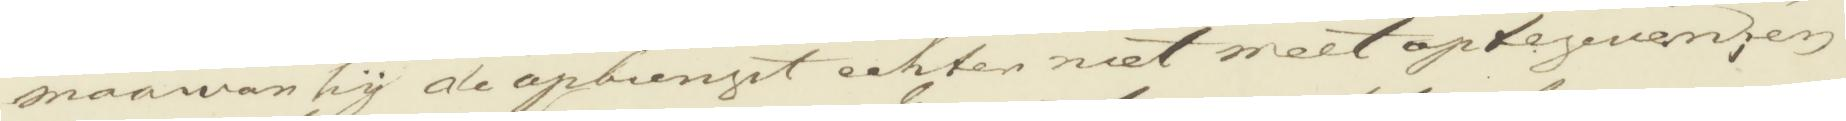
waarvan hij de opbrengst echter niet weet op te geven, en
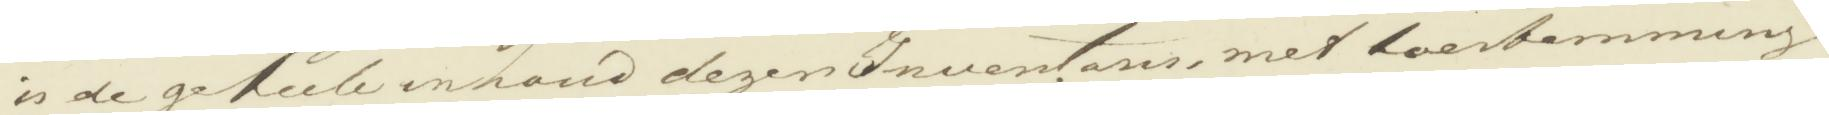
is de geheele inhoud dezer Inventaris, met toestemming
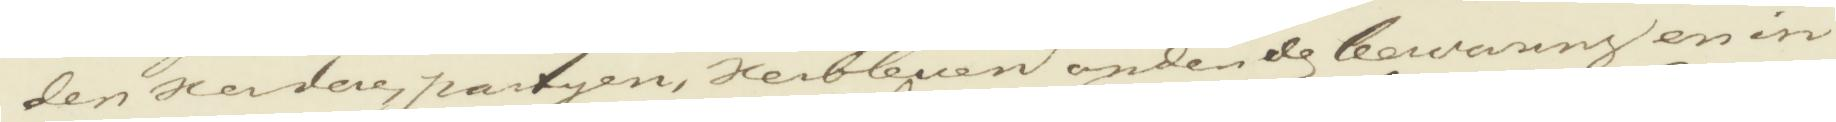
den verdere partyen, verbleven onder de bewaring en in
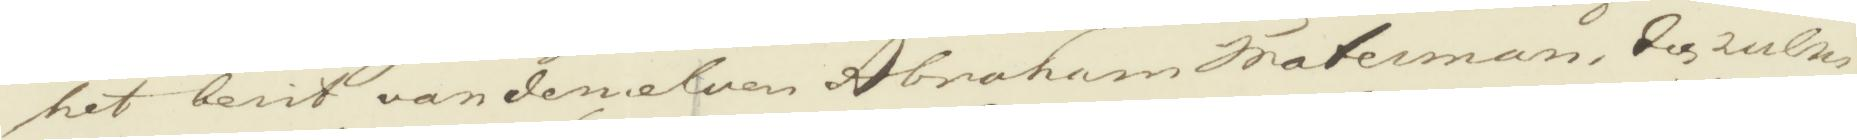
het bezit van dezelven Abraham Waterman, die zulks
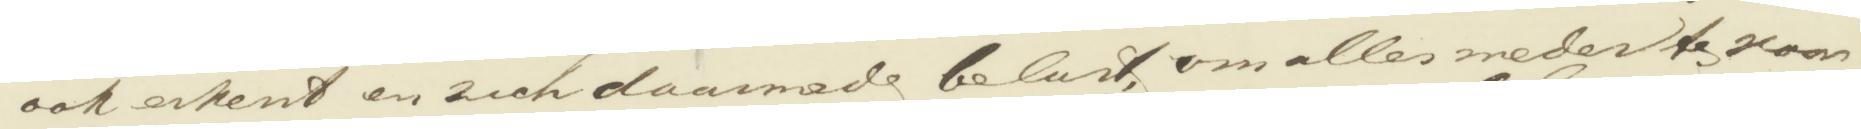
ook erkent en zich daarmede belast om alles weder te voor
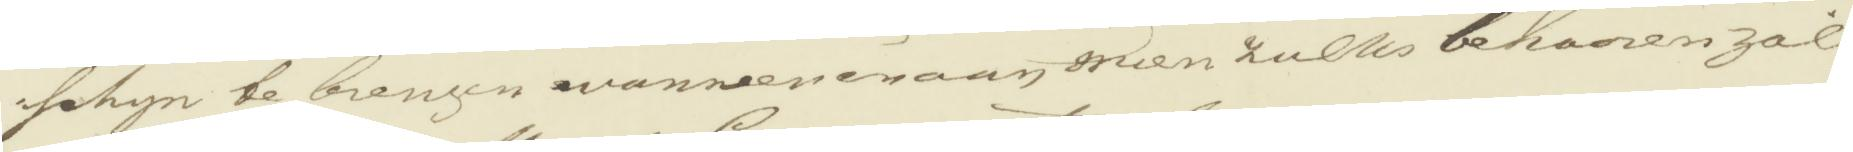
„schyn te brengen wanneer en aan wien zulks behooren zal,
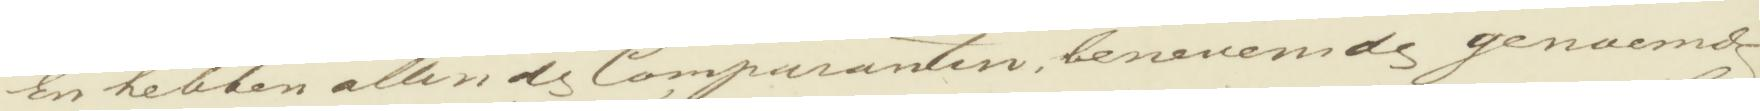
En hebben allen de Comparanten, benevens de genoemde
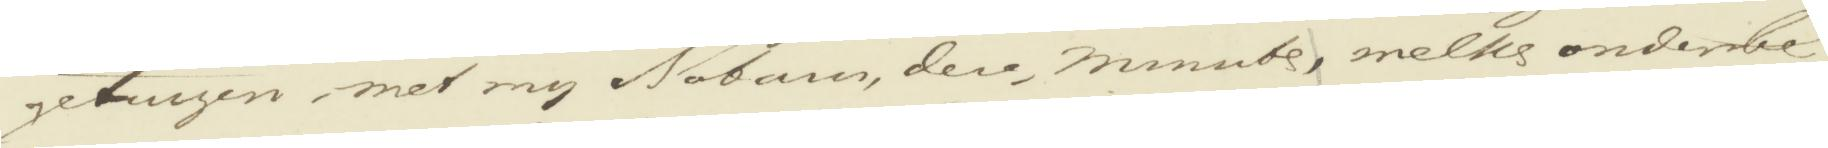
getuigen, met my Notaris, dese minute, welke onderbe,
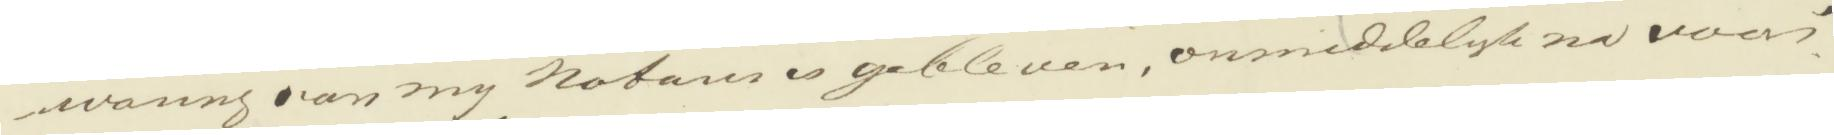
=waring van my Notaris is gebleven, onmiddelyk na voor
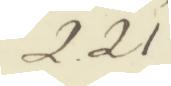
2.21
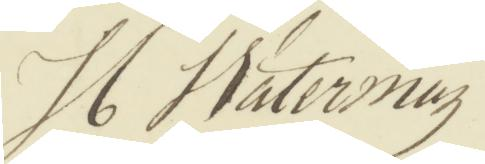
H Waterman
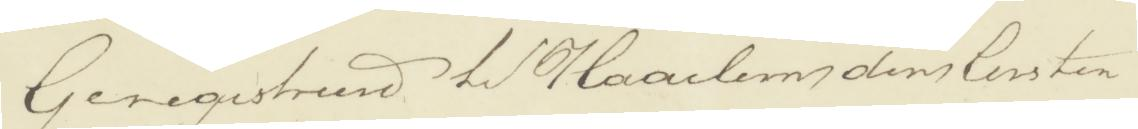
Geregistreerd te Haarlem, den Eersten
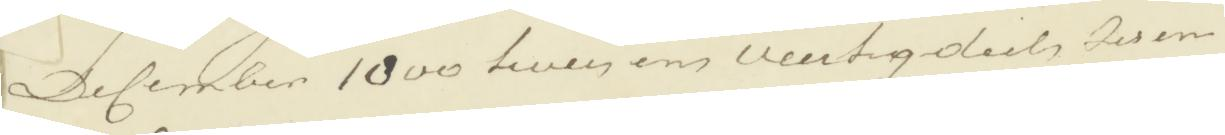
December 1800 twee en veertig deel, zes en
